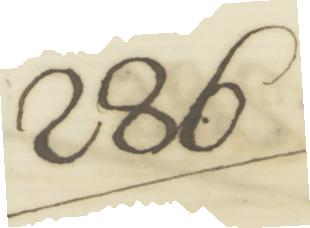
286
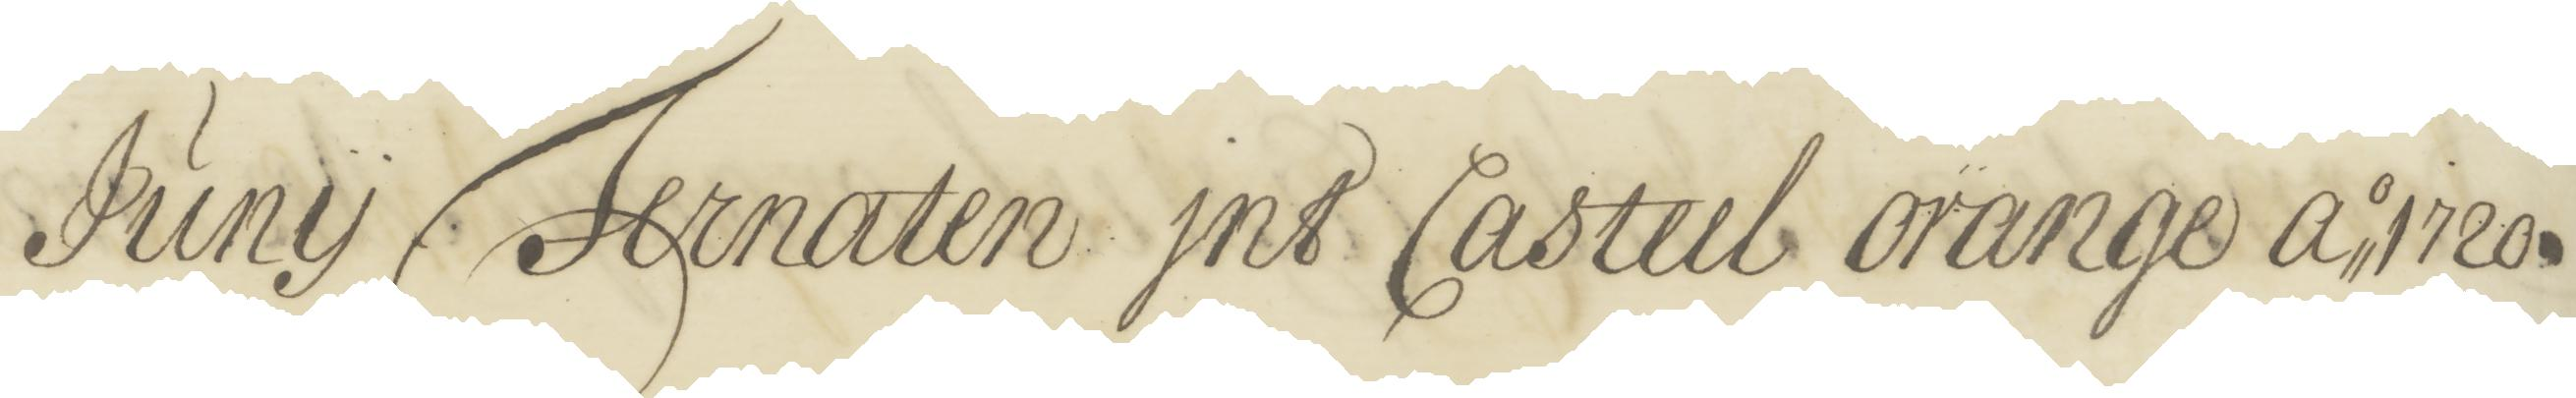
Iunij Ternaten jnt: Casteel orange a„o 1720.
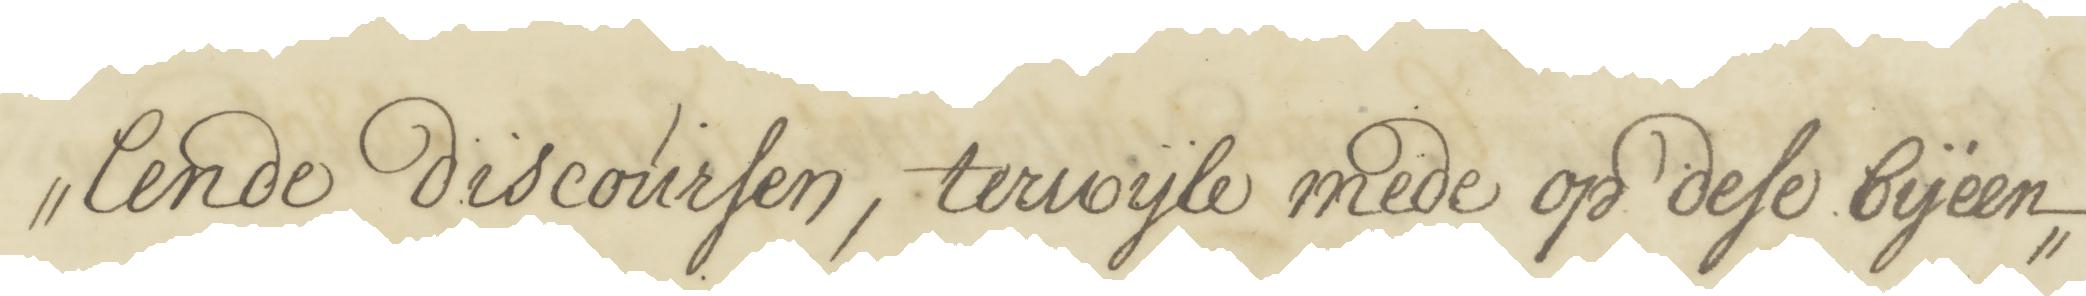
„lende discoursen, terwijle mede op dese bijeen„
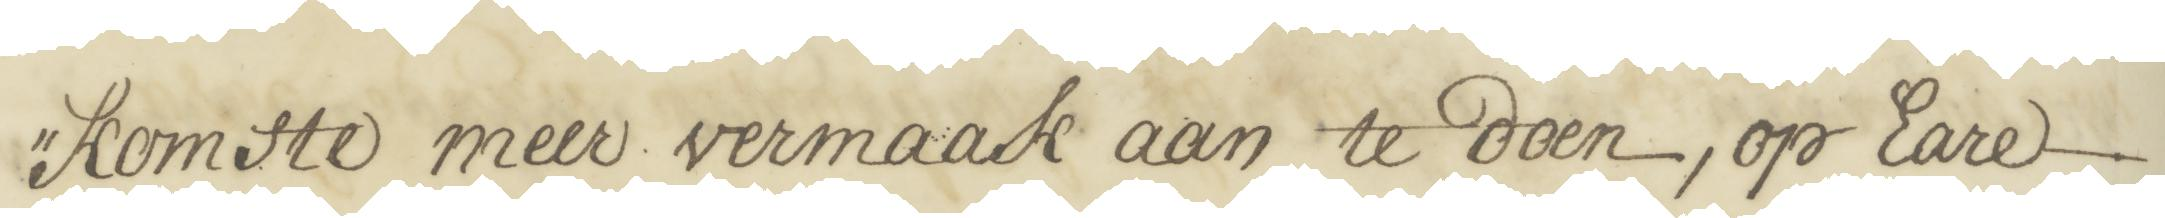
„komste meer vermaak aan te doen, op hare
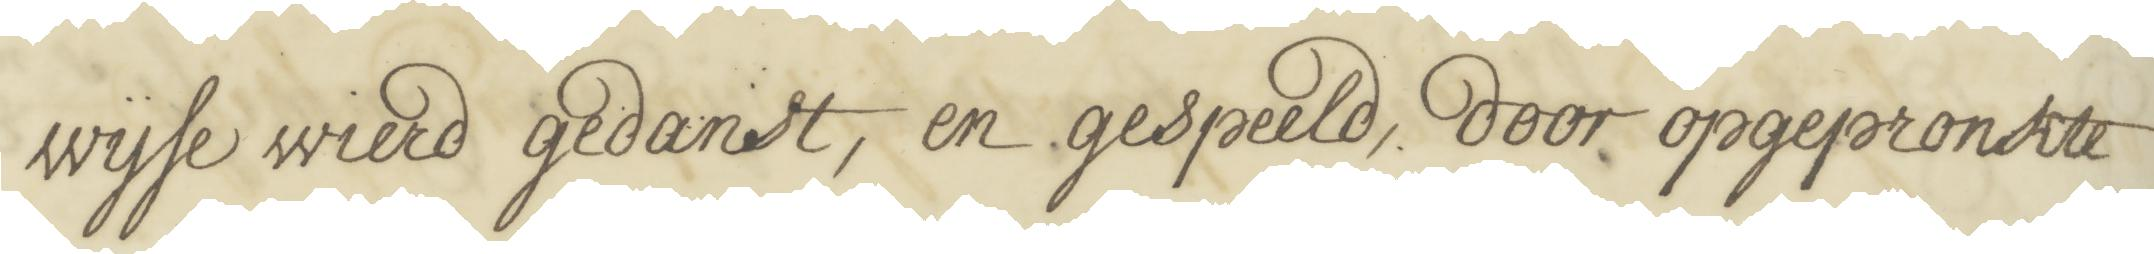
wijse wierd gedanst, en gespeeld, door opgepronkte
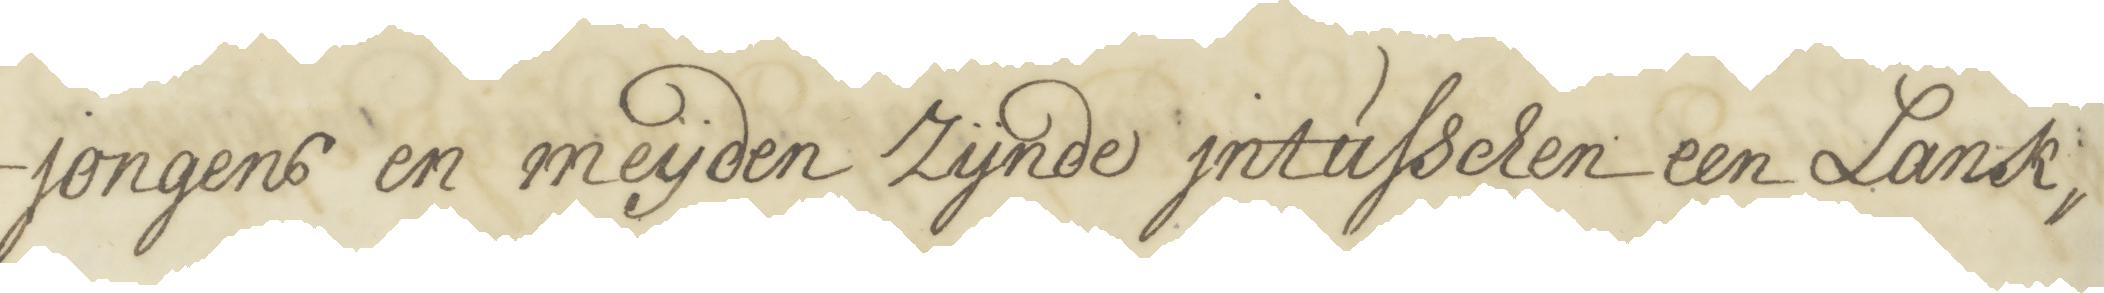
jongens en meijden Zijnde jntusschen een Lank„
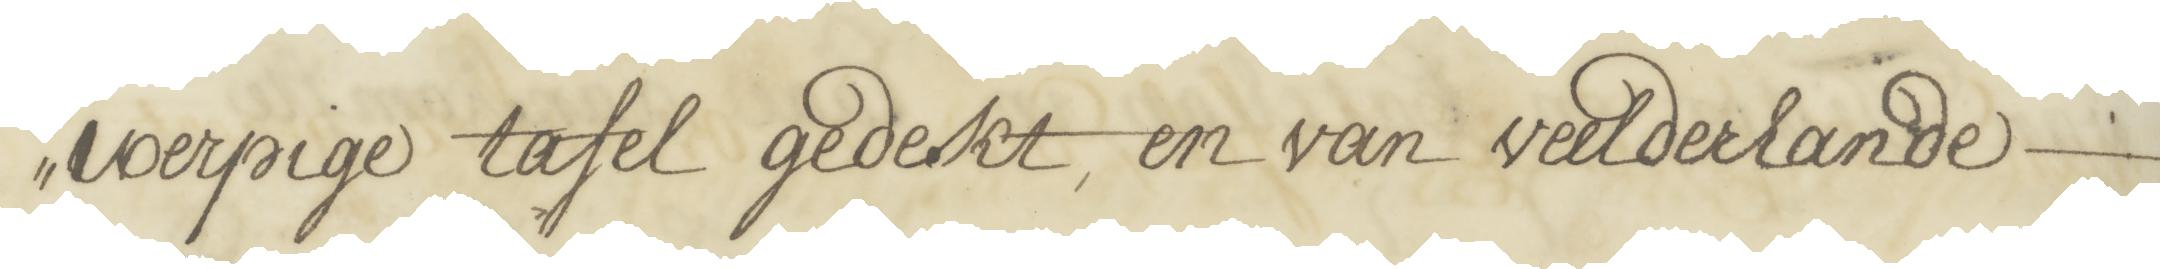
„werpige tafel gedekt, en van veelderhande —
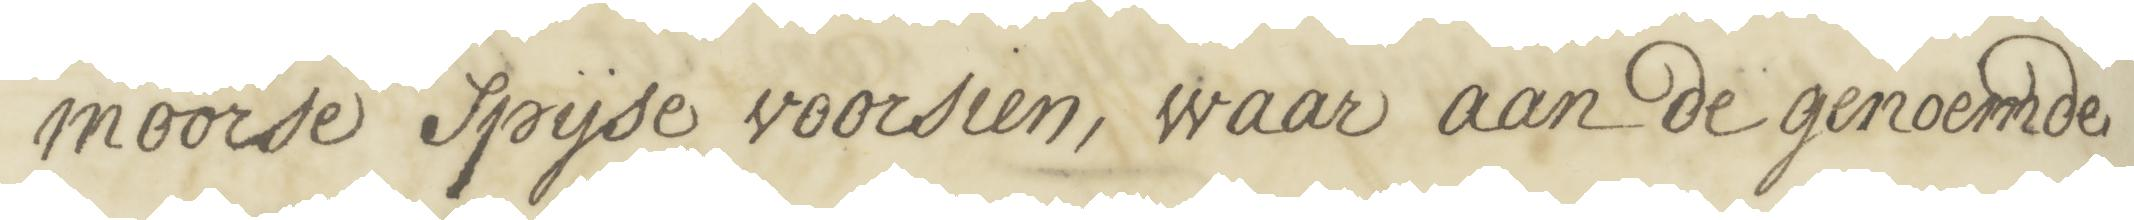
moorse Spijse voorsien, waar aan de genoemde
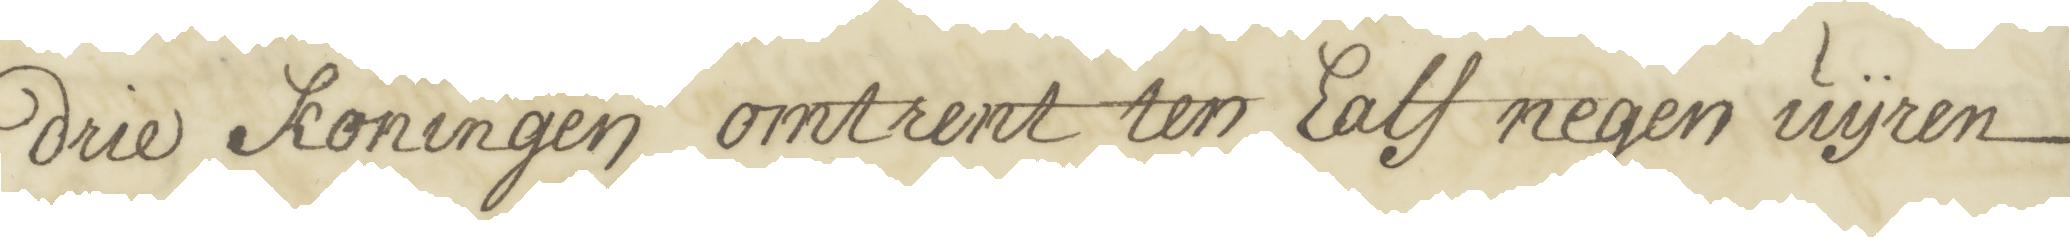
drie koningen omtrent ten half negen uijren
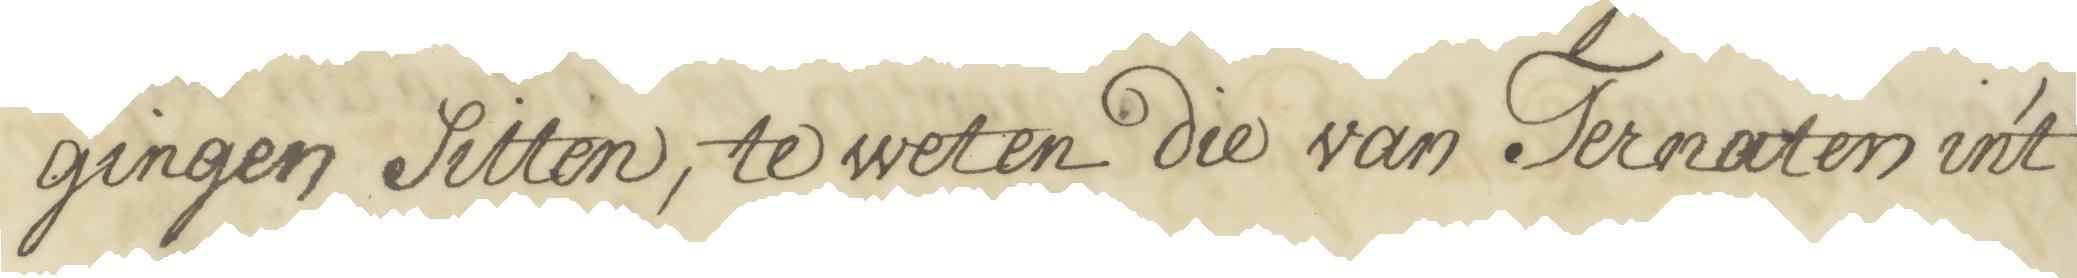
gingen Sitten, te weten die van Ternaten in’t
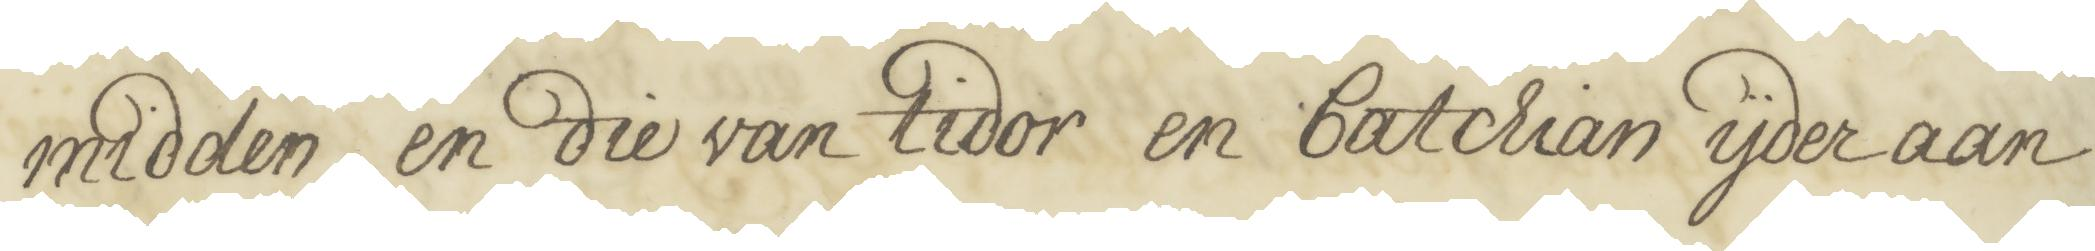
midden en die van tidor en batchian ijder aan
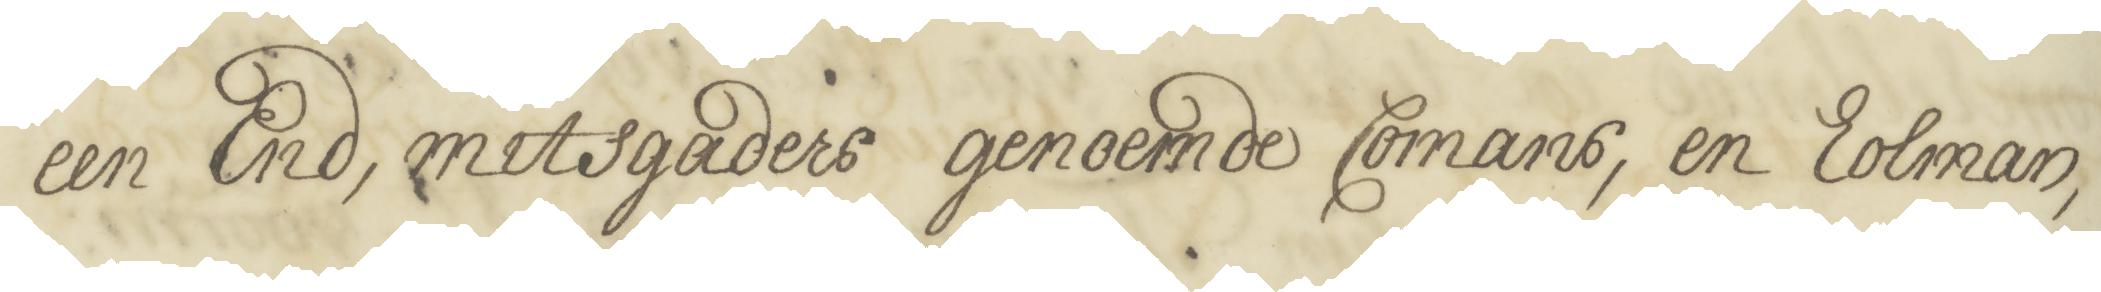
een End, mitsgaders genoemde Comans, en holman,
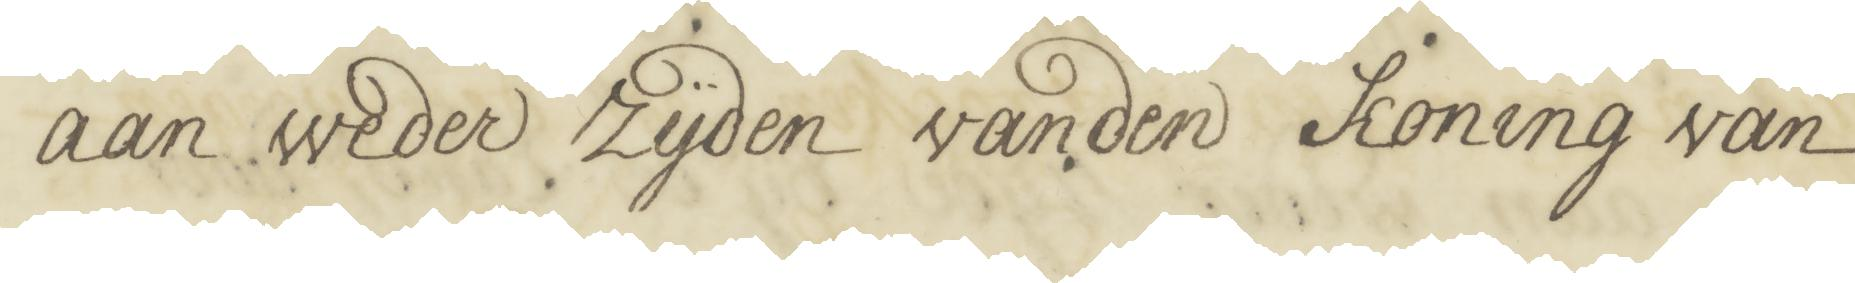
aan weder zijden van den Koning van
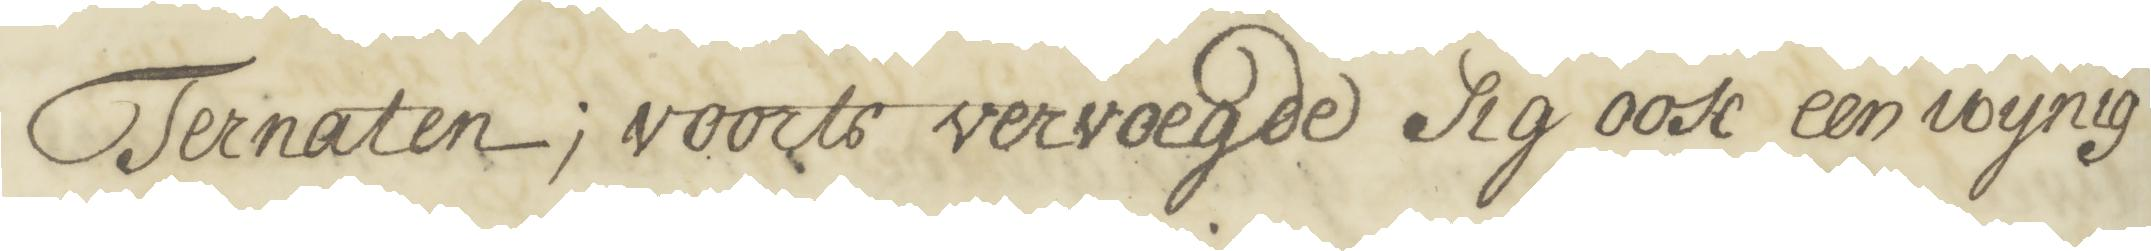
Ternaten; voorts vervoegde sig ook een wynig
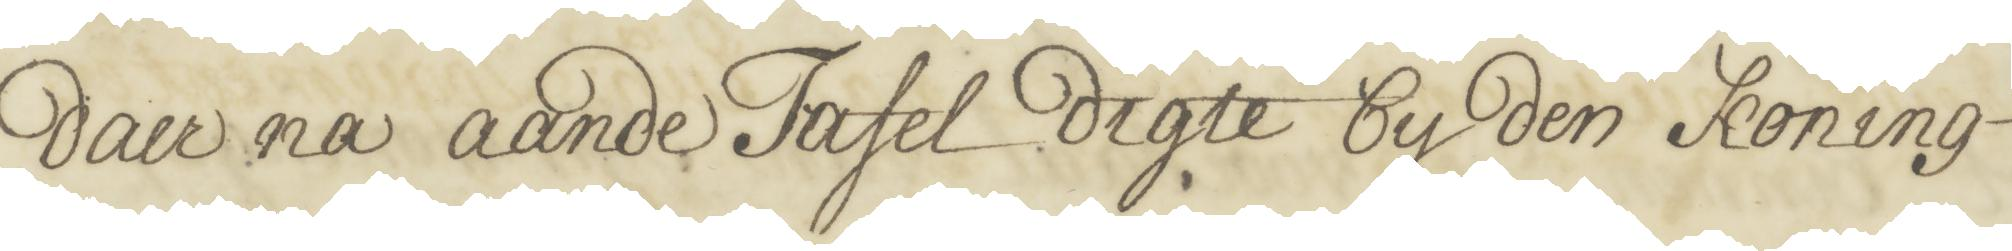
daer na aande Tafel digte by den koning
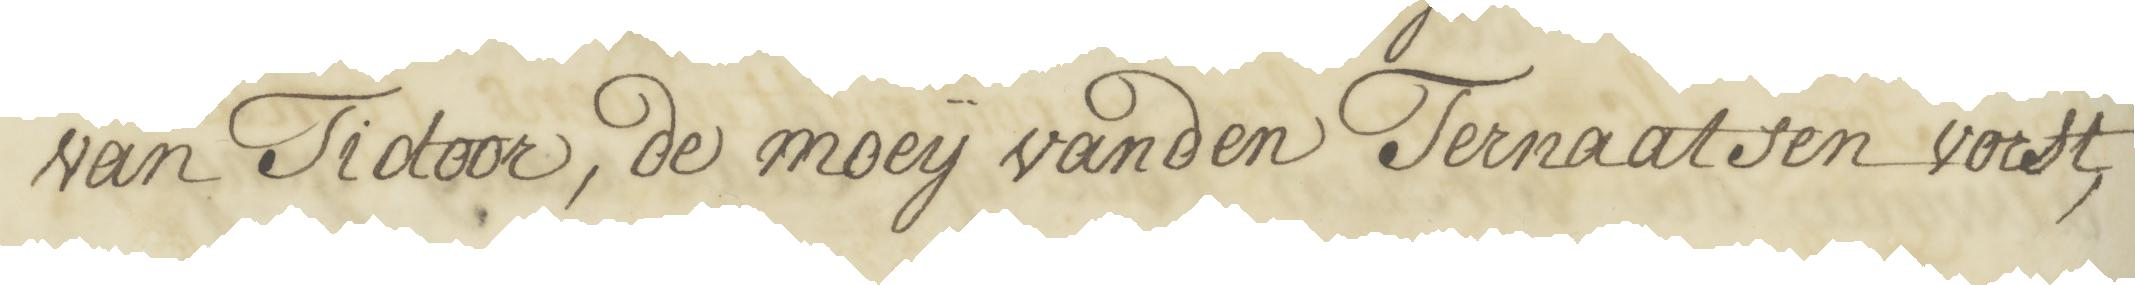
van Tidoor, de moeij van den Ternaatsen vorst,
